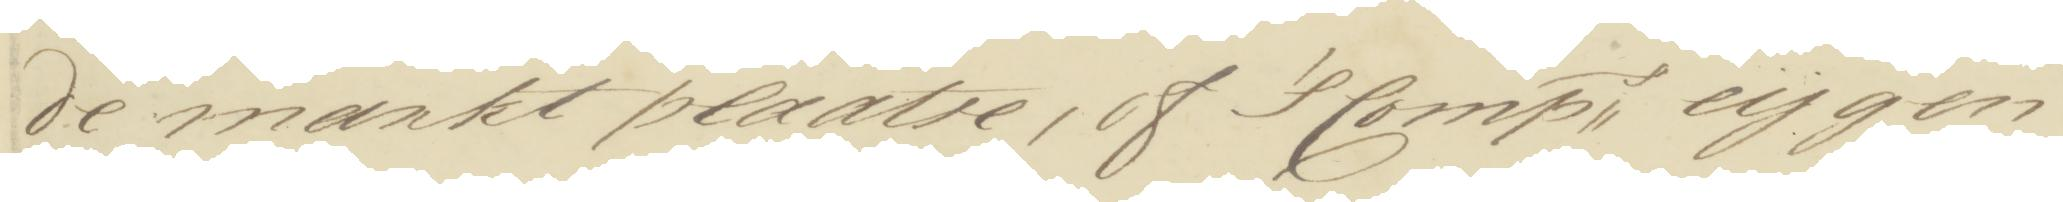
de markt plaatse, of ’s comp„s eijgen
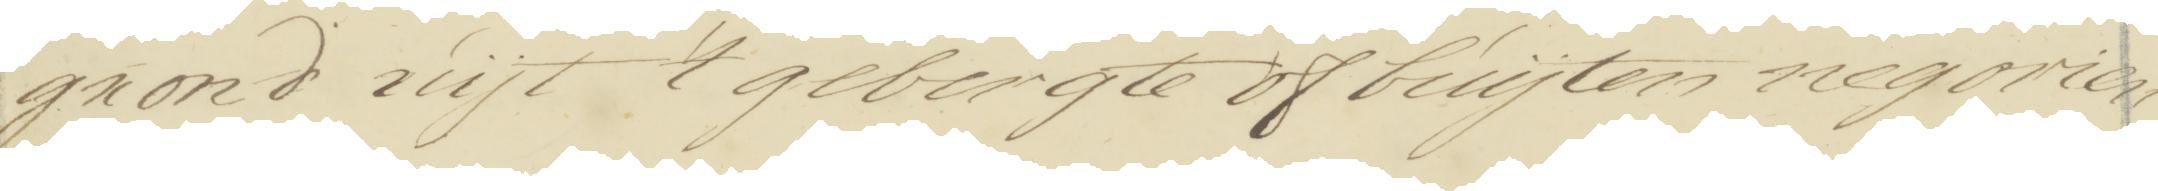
grond uijt ’t gebergte of buijten negorien
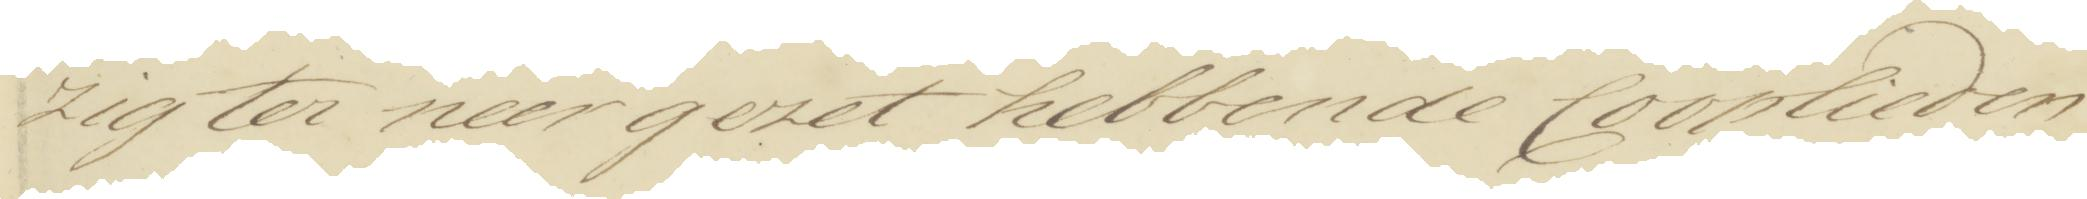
zig ter neer gezet hebbende Cooplieden
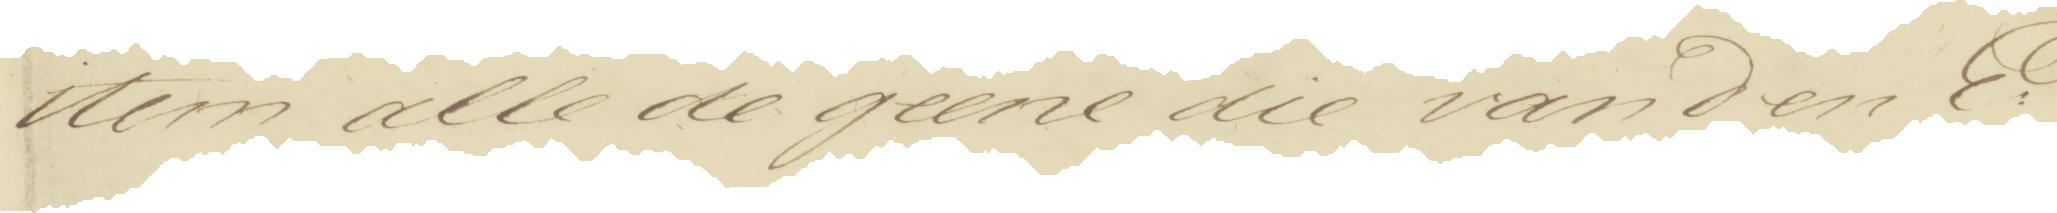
item alle de geene die van den E:
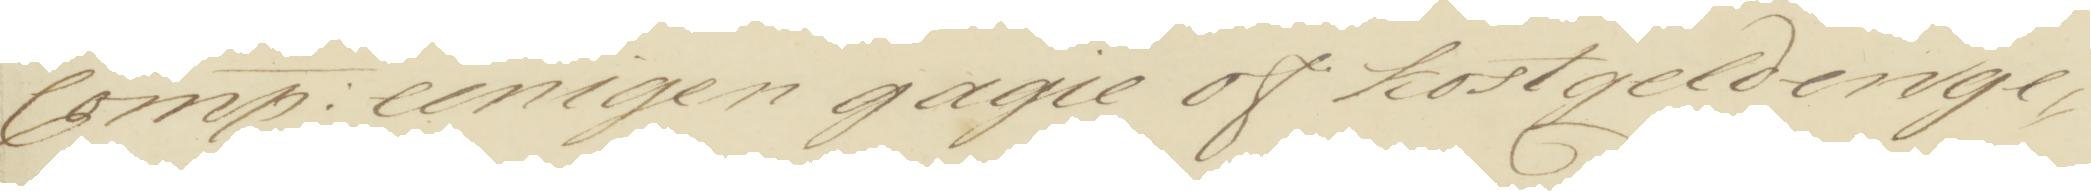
Comp: eenigen gagie of kostgelden ge„
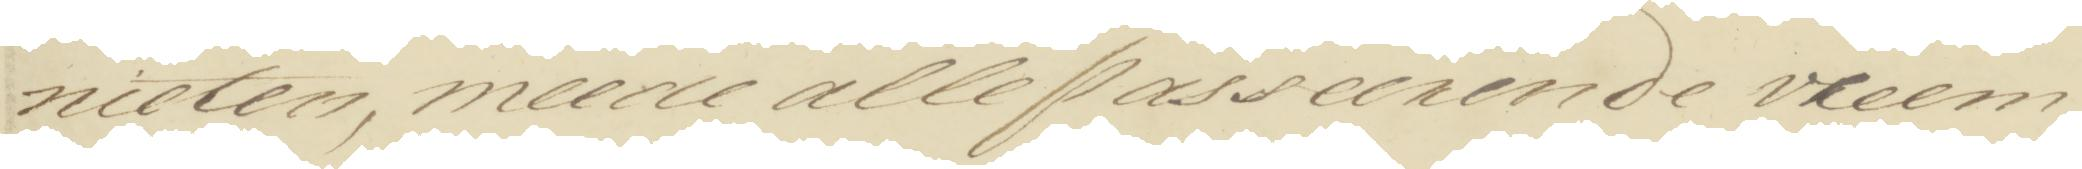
nieten, meede alle passeerende vreem
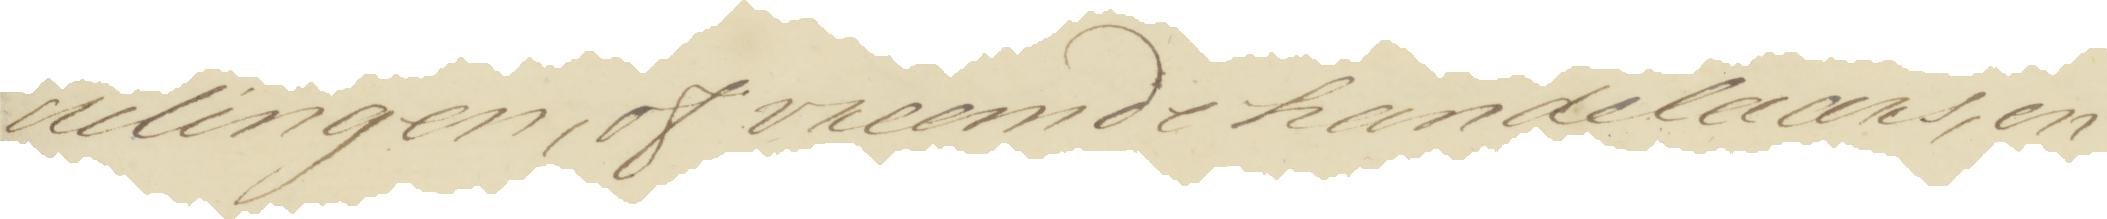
delingen, of vreemde handelaars, en
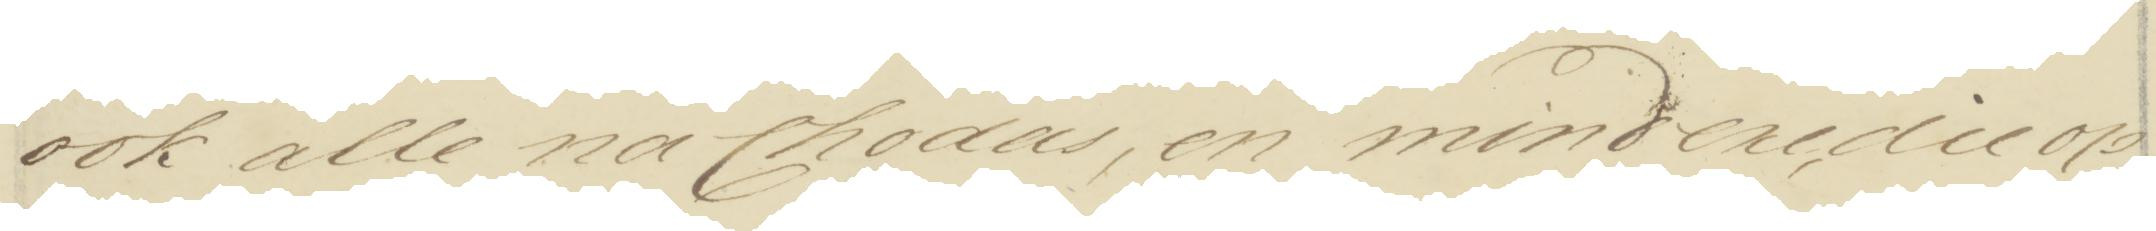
ook alle na chodas, en mindere, die op
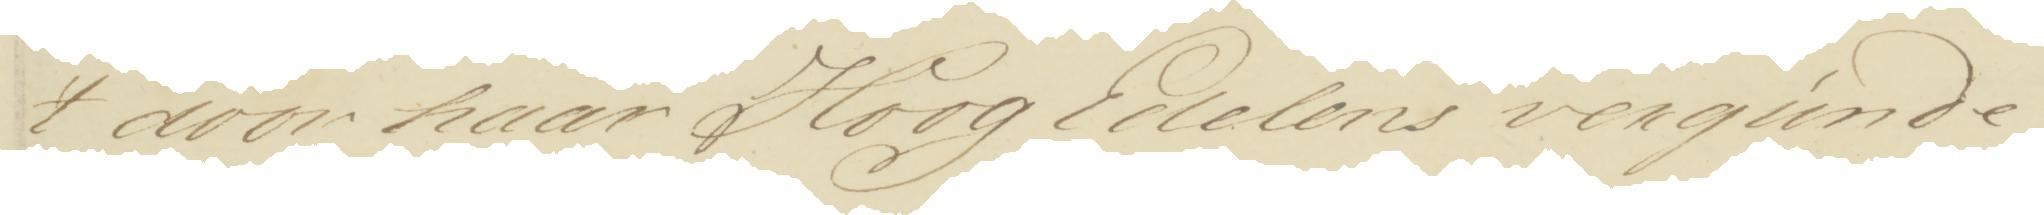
’t door haar Hoog Edelens vergunde
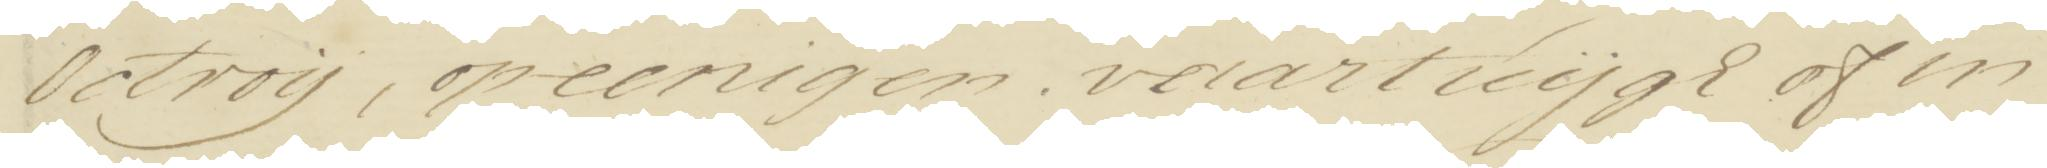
Octroij, op eenigen . vaartuijgh of in
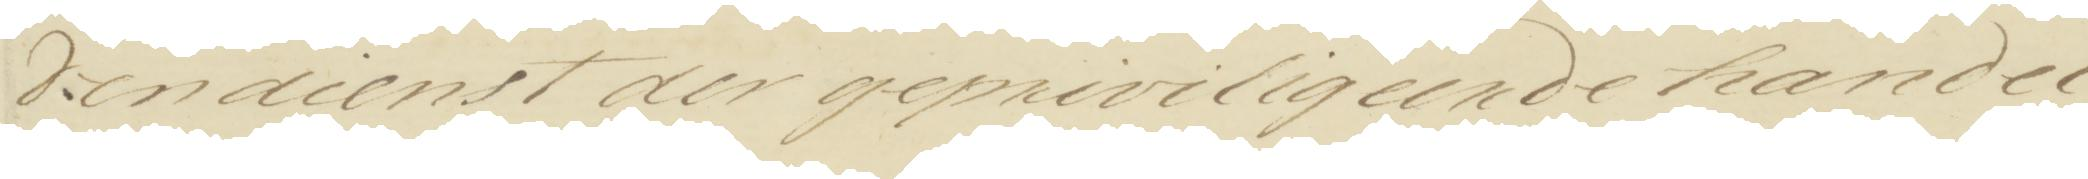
den dienst der gepriviligeerde handel
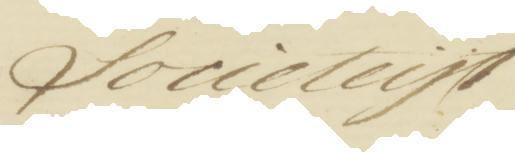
Societeijt
